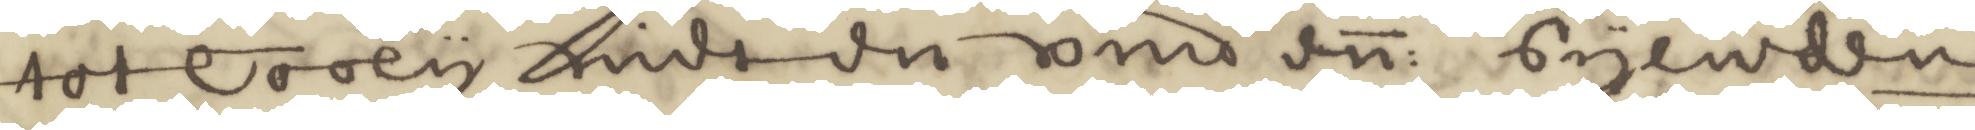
tot Coslij nieten vind en: sij lieden
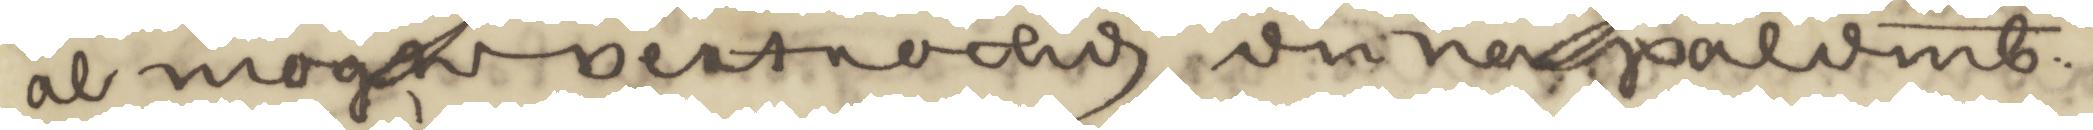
al mogte vertrocken, en na palemb:
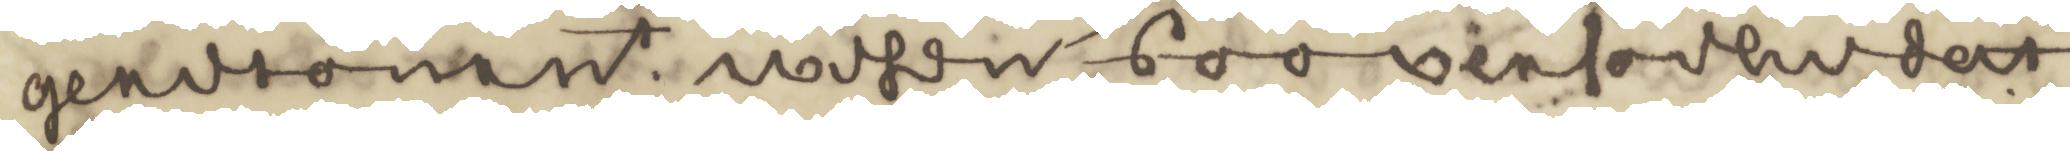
geretourn.t wesen soo versoeke dat
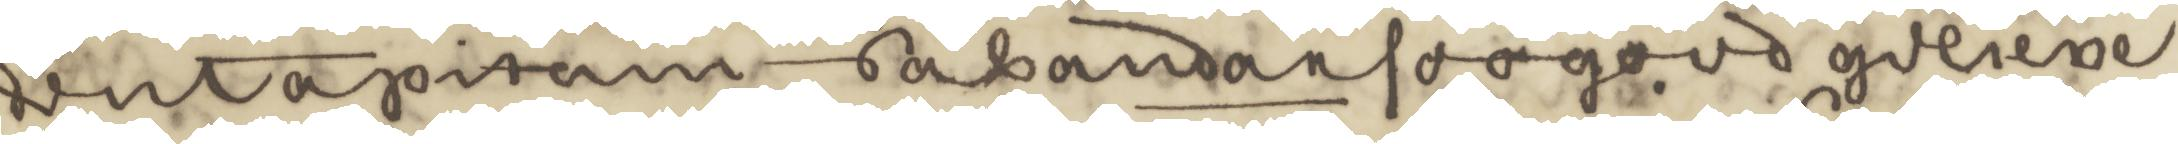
den Capitain sabandar soo goed gelieve
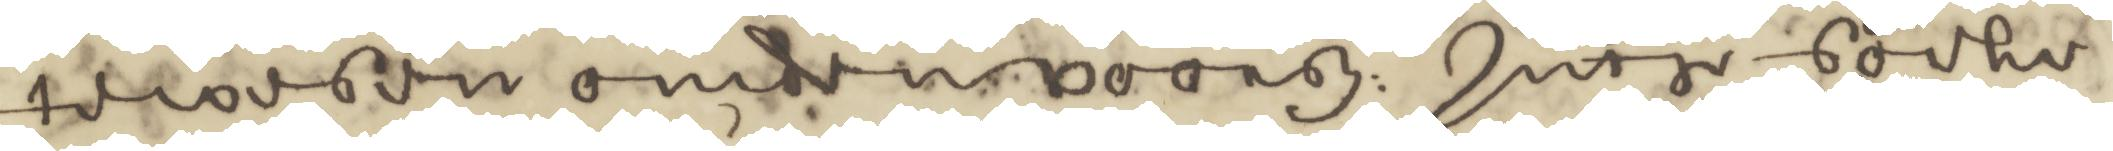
tewesen om den voorsz: Intje soeke
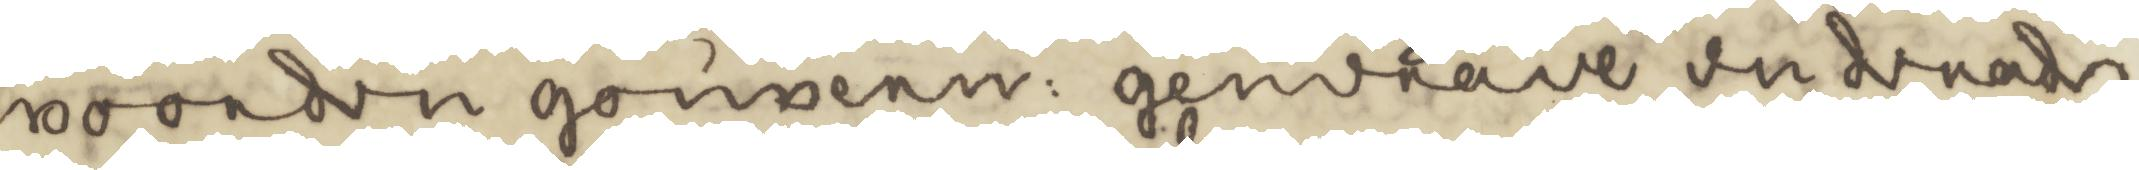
woorden gouvern: generael en de raden
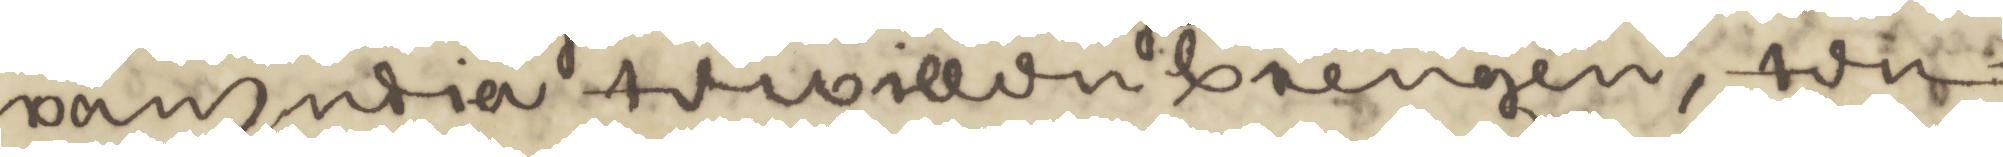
van jndia tewillen brengen, ten
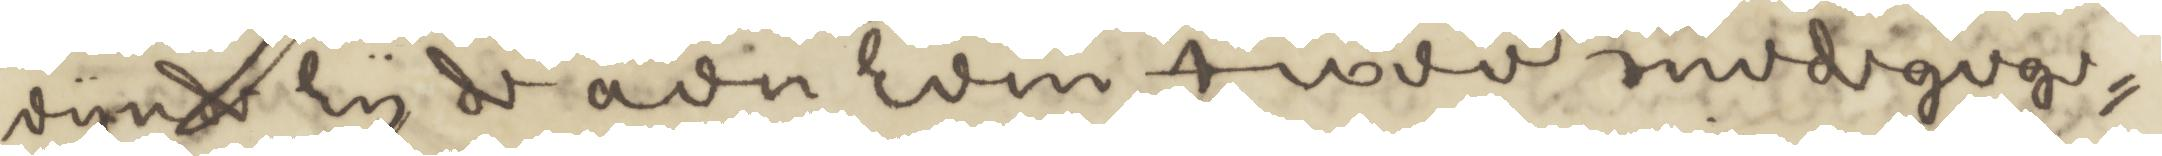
eijnde hij de aen hem twee medegege„
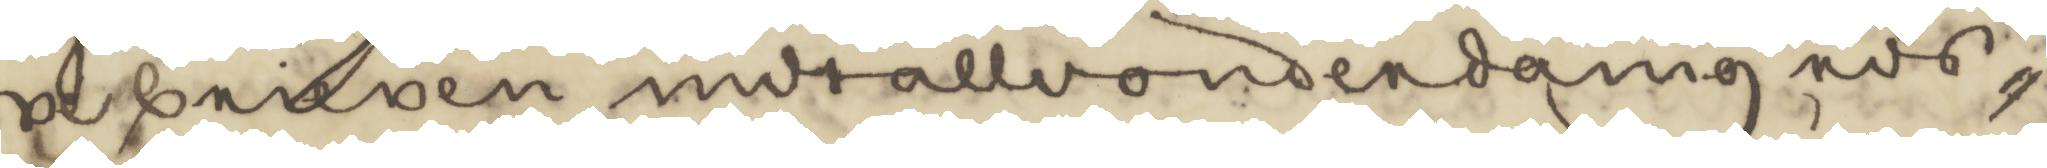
ve brieven metalle onderdanig res„
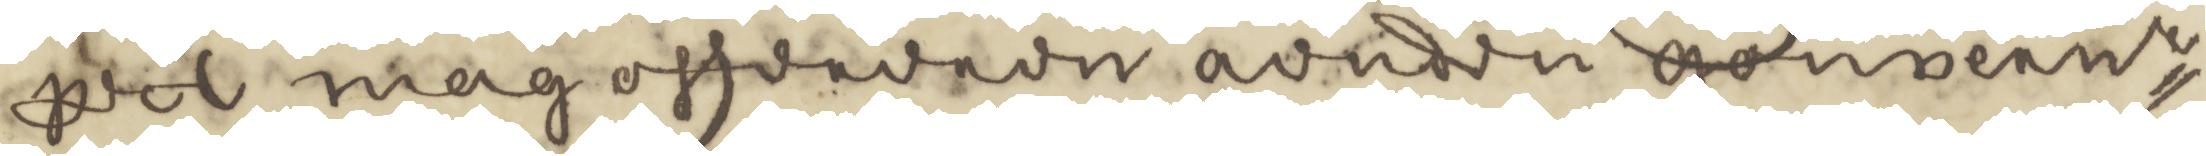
pect mag offereren aenden gouvern„r
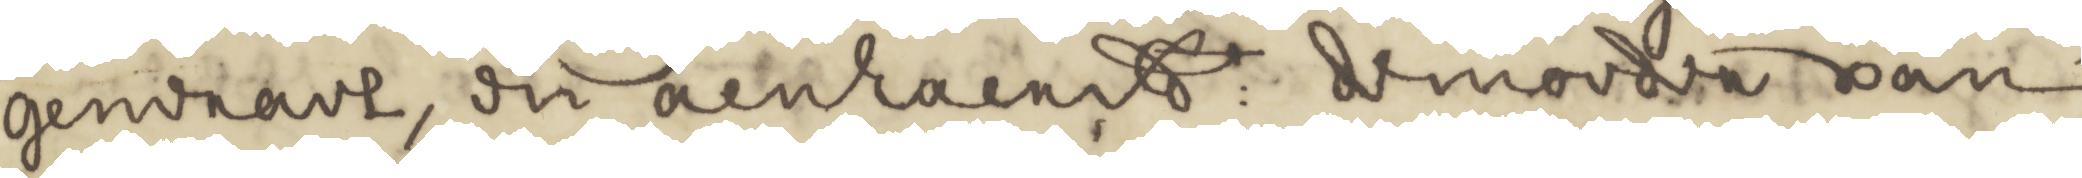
generael, en aen haer Ed:t demoeder van
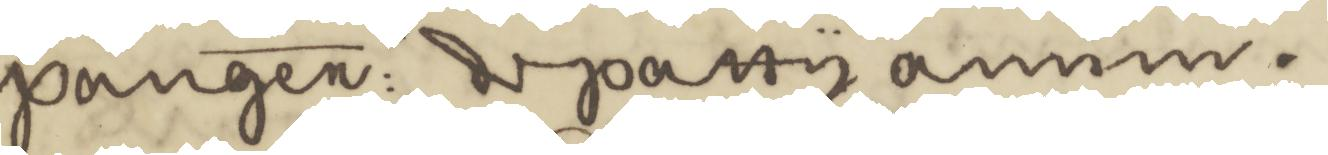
panger: depattij anum.
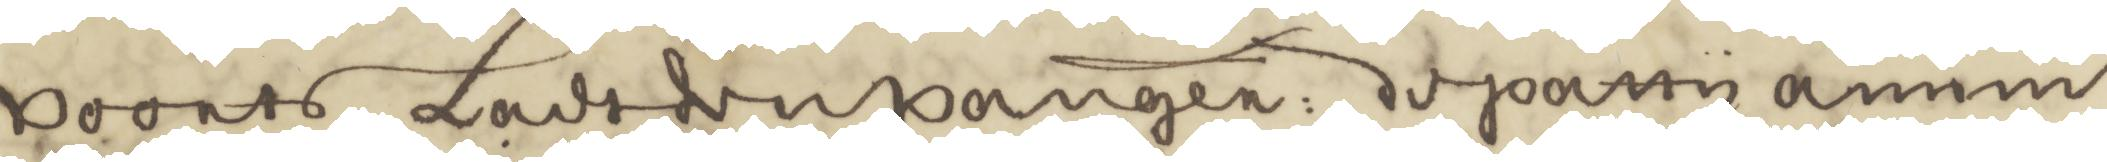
voorts laetdenpanger: depattij anum
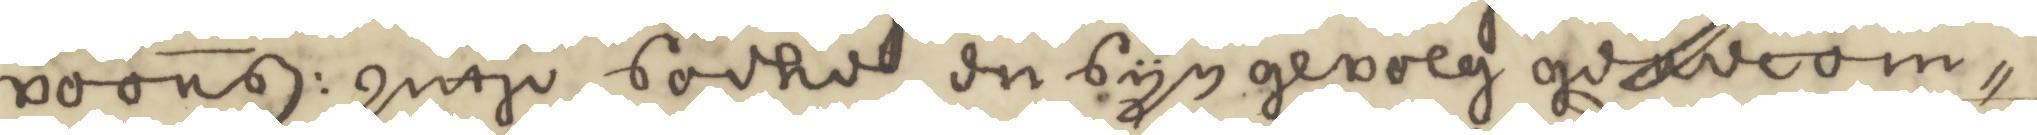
voorsz: jntje soeke, en sijn gevolg gerecom„
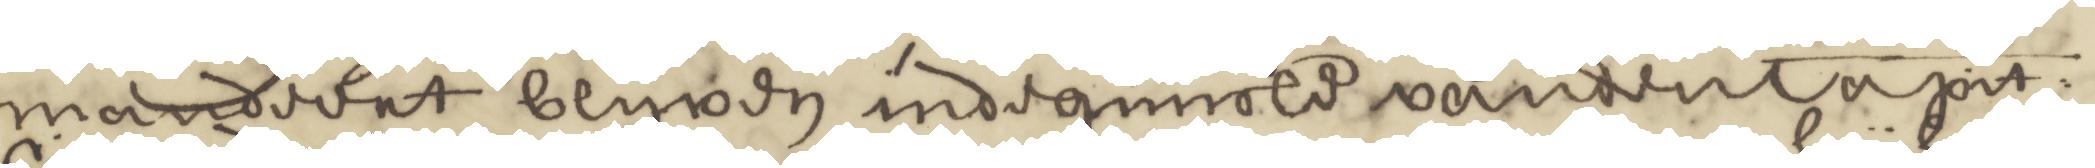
mandeert blijven in de gunste vanden Capit:
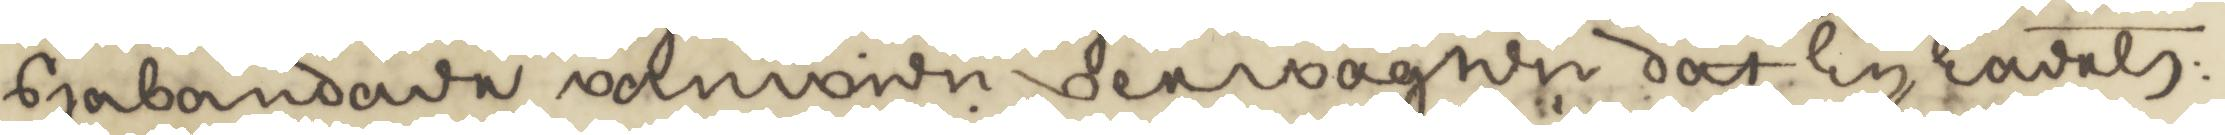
sjabandaer vanwien verwagten dat hij haerlijk
